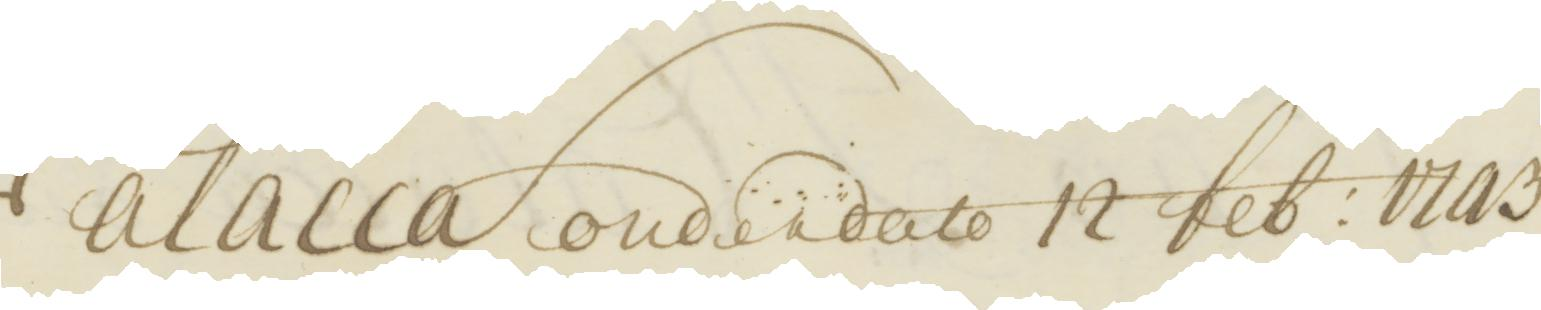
Malacca onder dato 12 feb: 1743
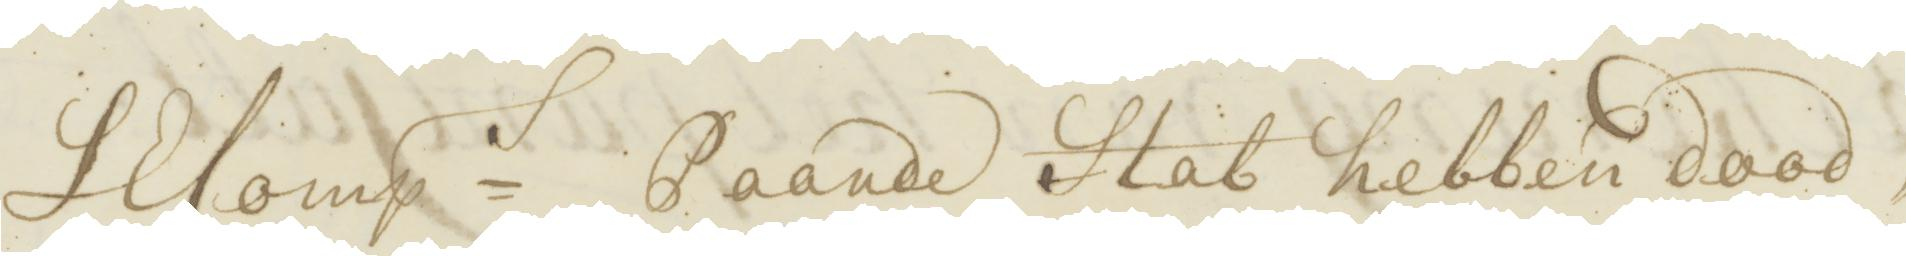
SE Comp=s Paarde stal hebben dood„
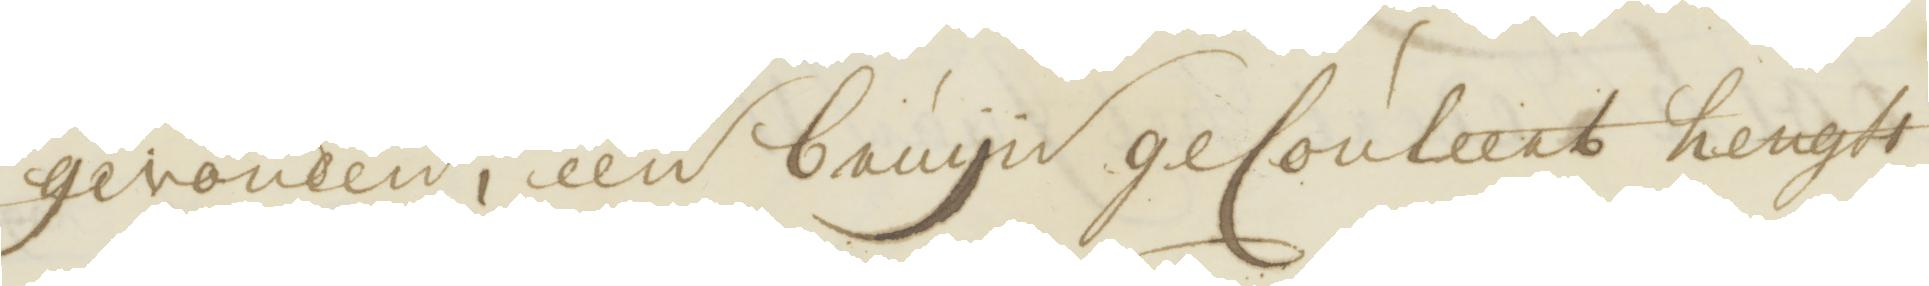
gevonden, een bruijn gecouleert hengst
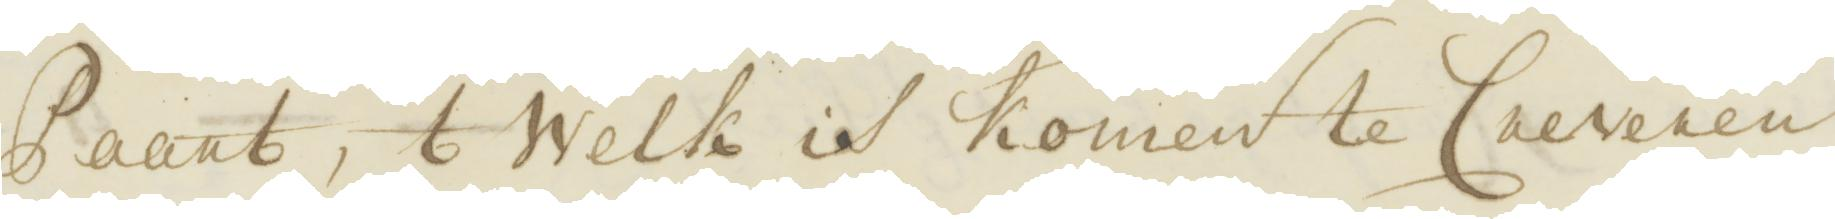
Paart, 't welk is komen te Creveren
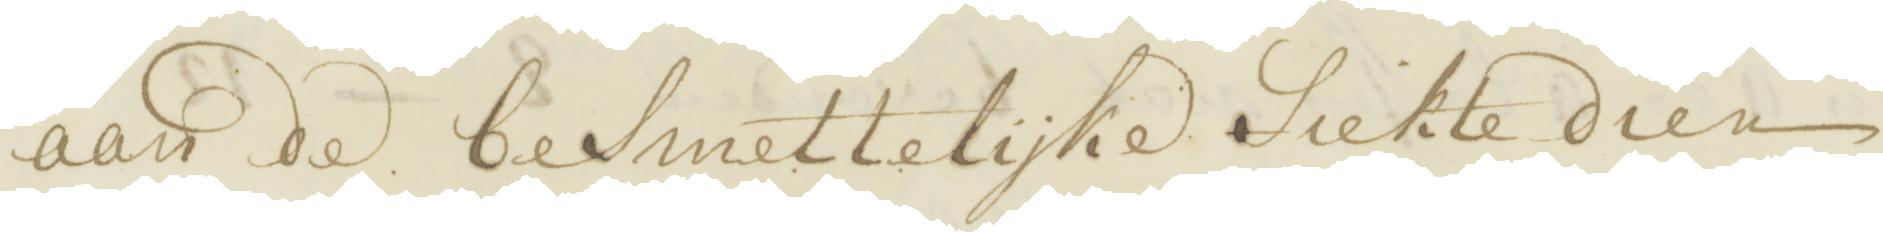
aan de besmettelijke siekte dier
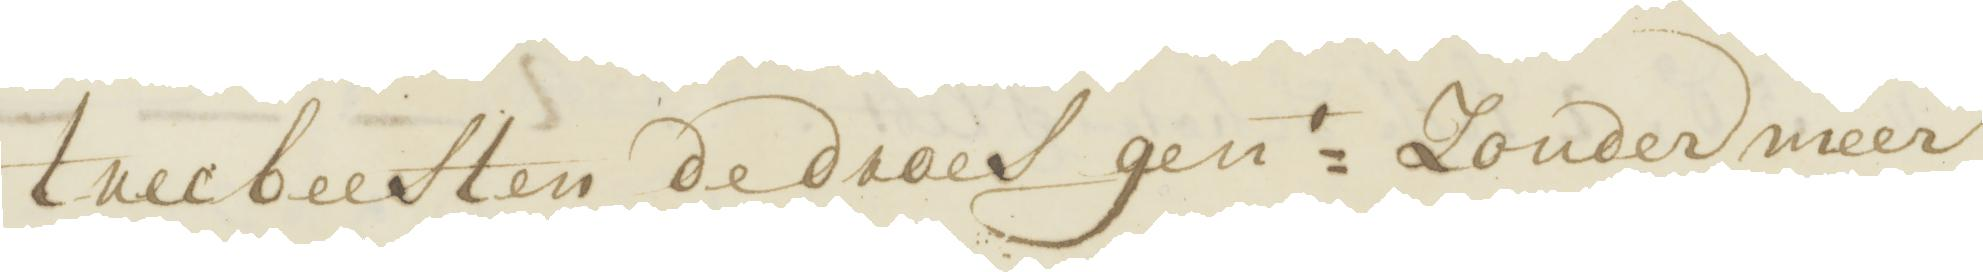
trecbeesten de droes gen=t Zonder meer
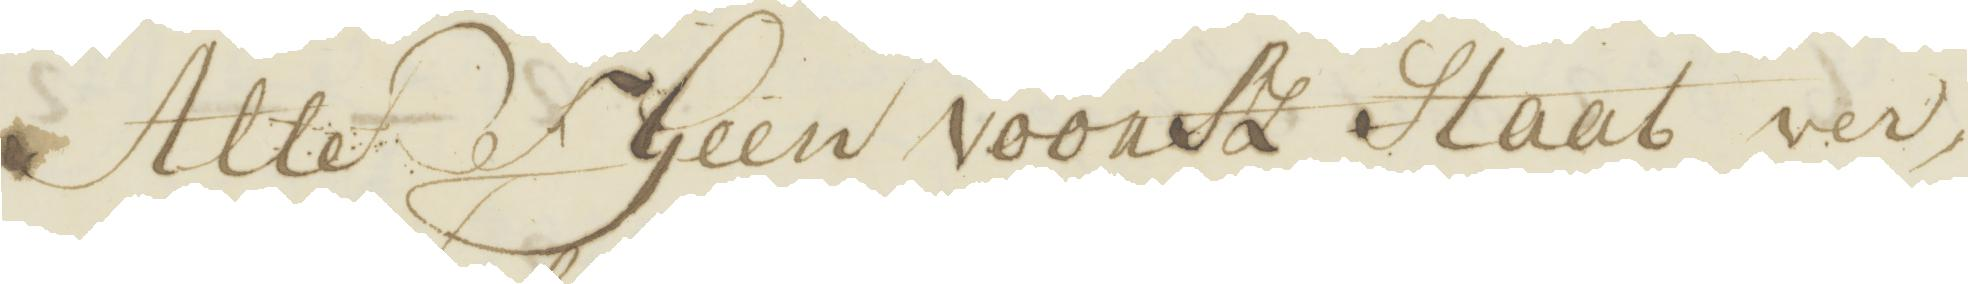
Alle 't Geen voorsz staat ver„
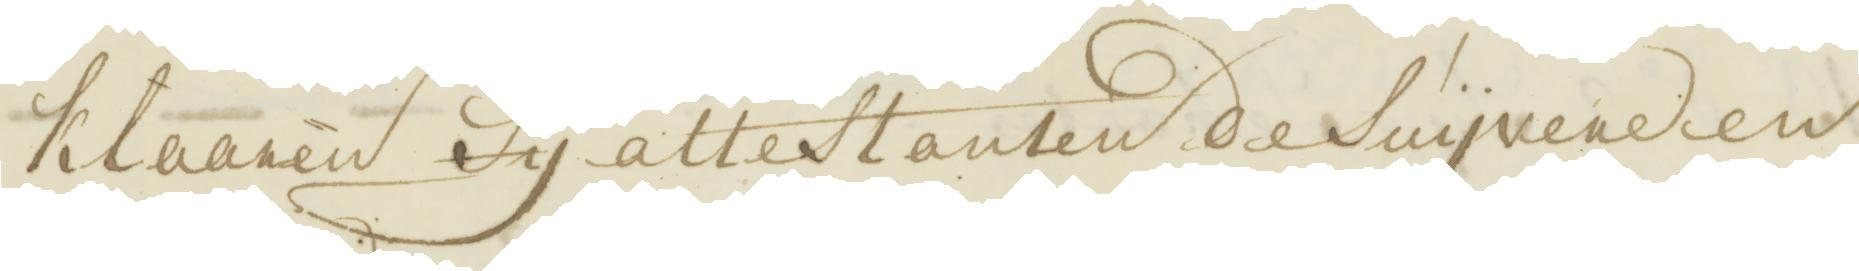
klaaren Sy attestanten de suijvere en
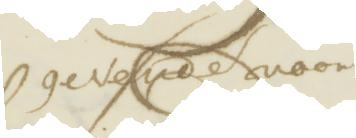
gevende voor
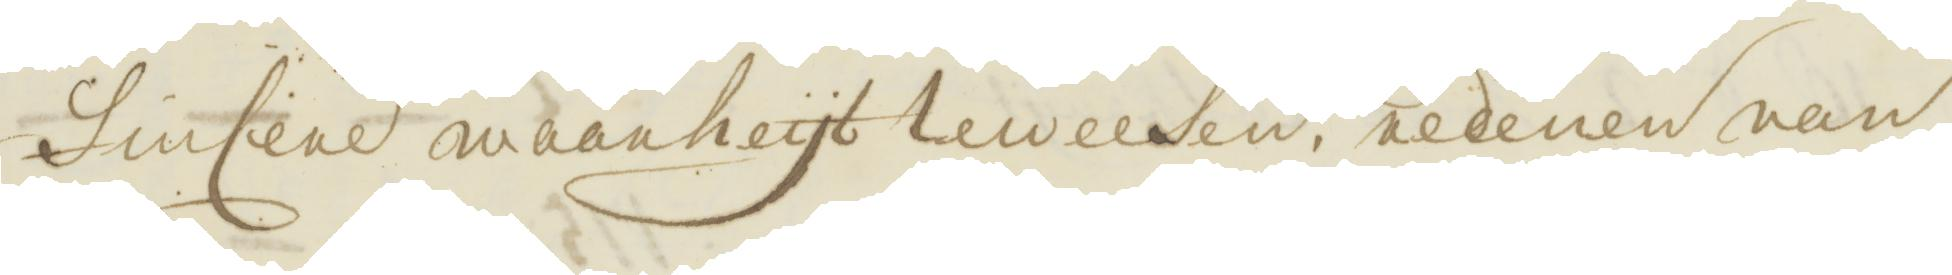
Sincere waarheijt te weesen, redenen van
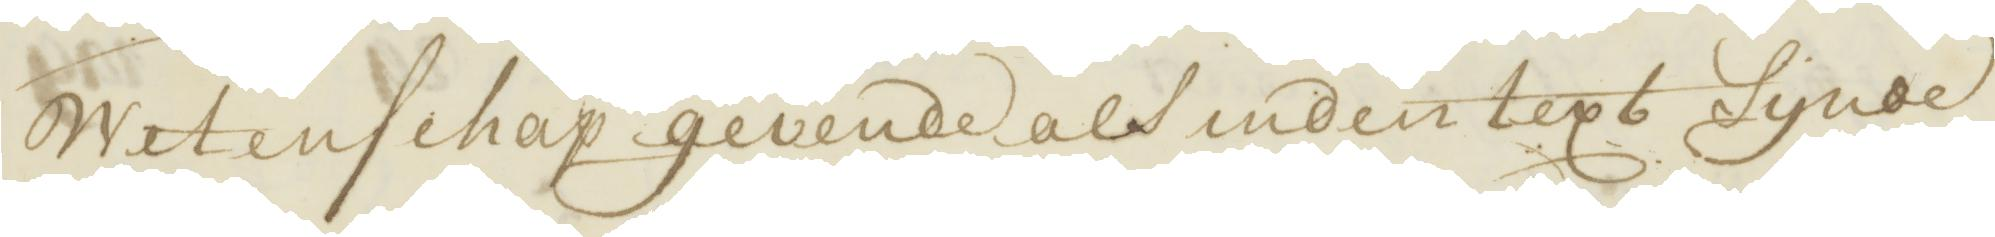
Wetenschap gevende als inden text Sijnde
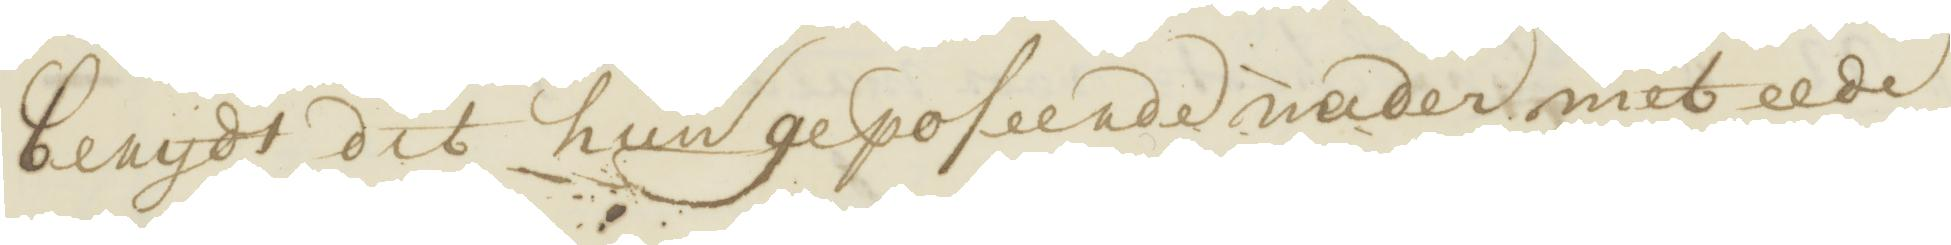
berijdt dit hun geposeerde nader met eede
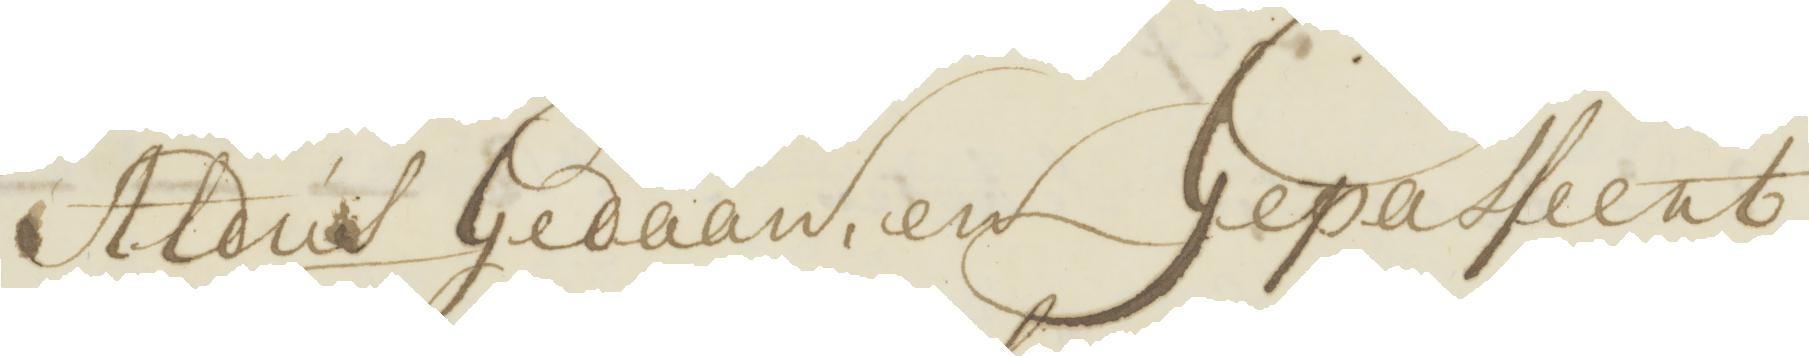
Aldus Gedaan, en Gepasseert
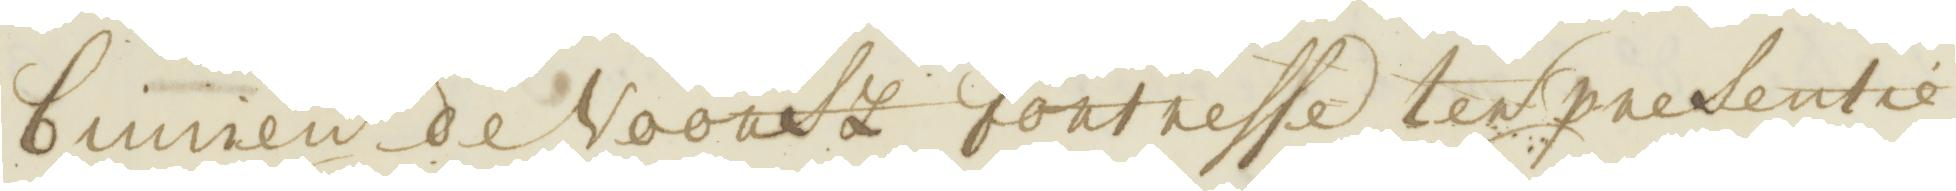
binnen de Voorsz fortresse ter presentie
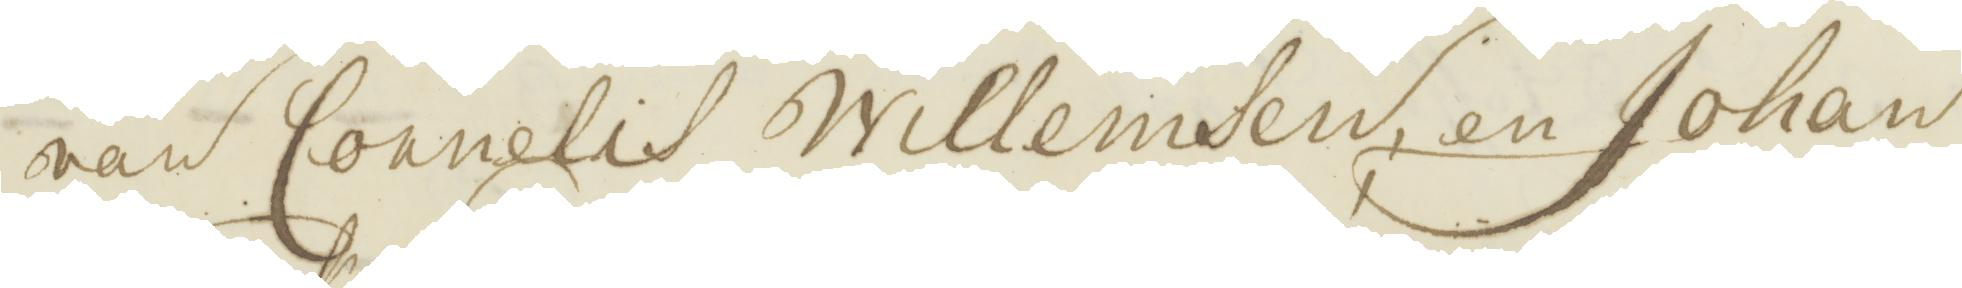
van Cornelis Willemsen, en Johan
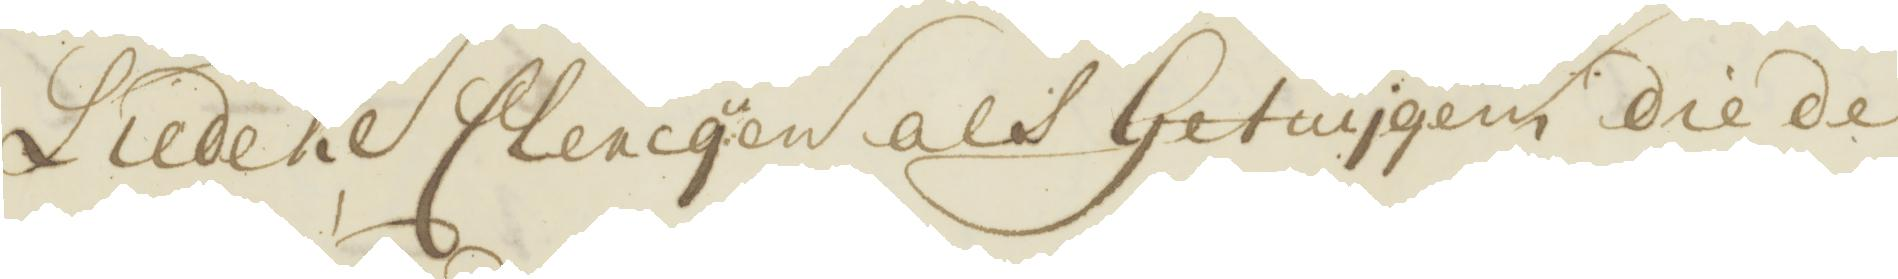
Liedeke Clercquen als Getuijgen, die de
